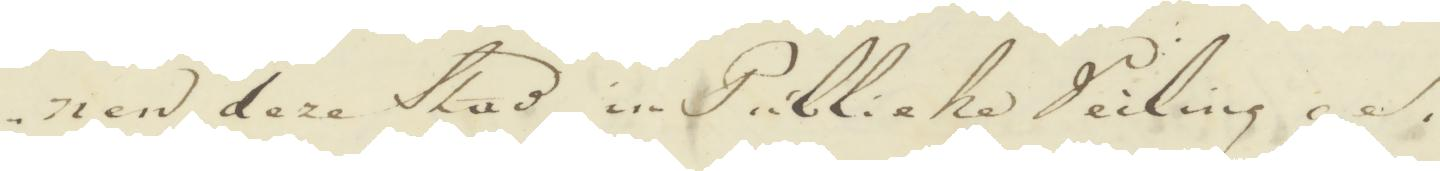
„nen deze stad, in Publieke Veiling ge,
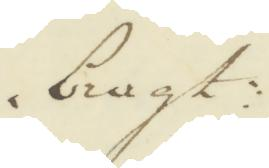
„bragt:
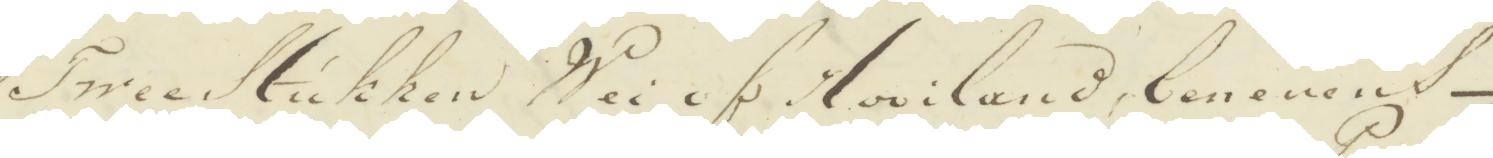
Twee stukken Wei of Hooiland, benevens
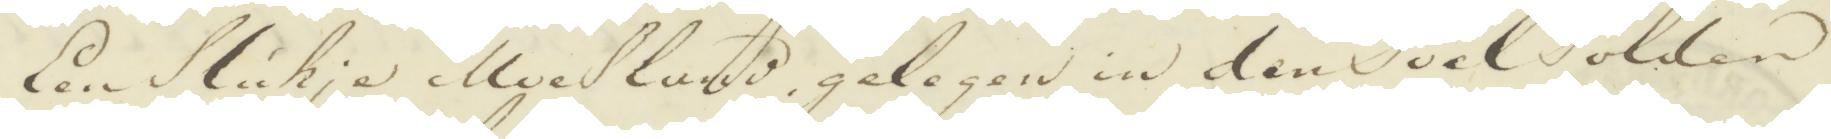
Een stukje Moesland, gelegen in den Poel Polder
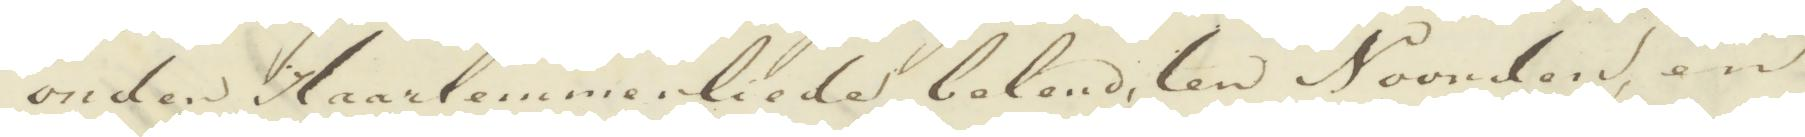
onder Haarlemmerliede, belend, ten Noorden, en
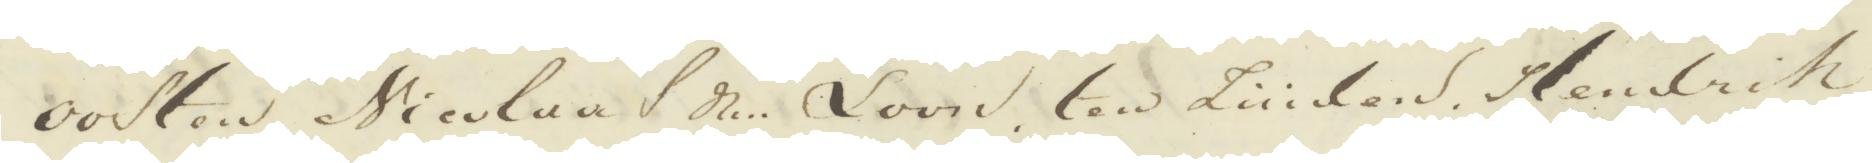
oosten, Nicolaas van Loon, ten Zuiden, Hendrik
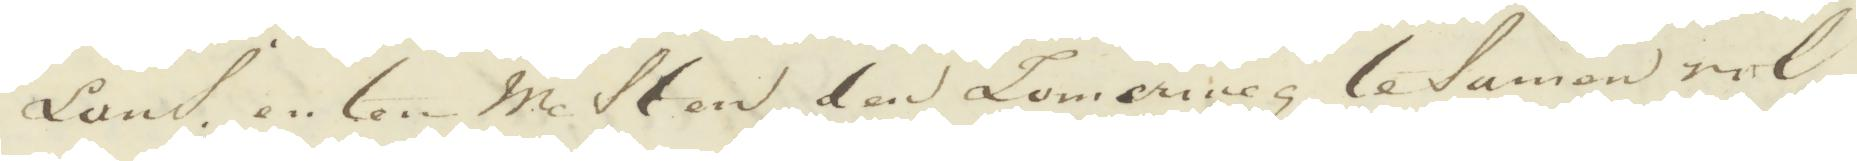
Lans, en ten westen den Zomerweg, te samen vol.
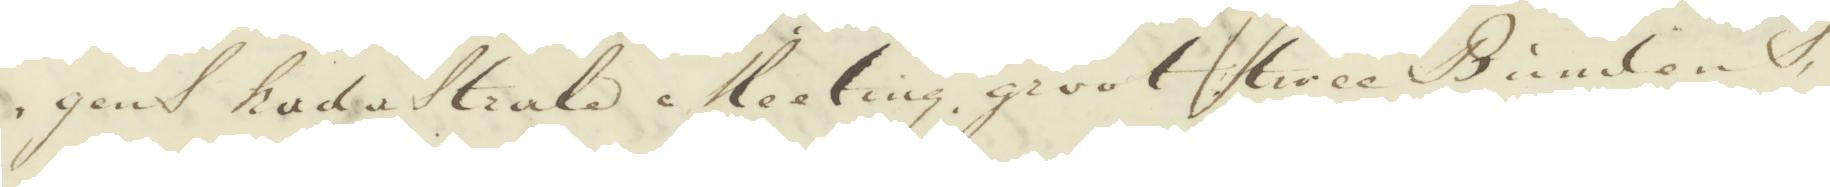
„gens kadastrale Meeting, groot twee Bunders,
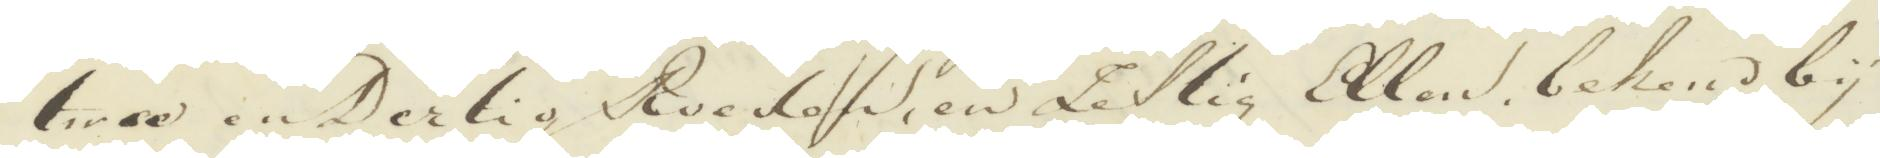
twee en Dertig Roeden, en Zestig Ellen, bekend bij
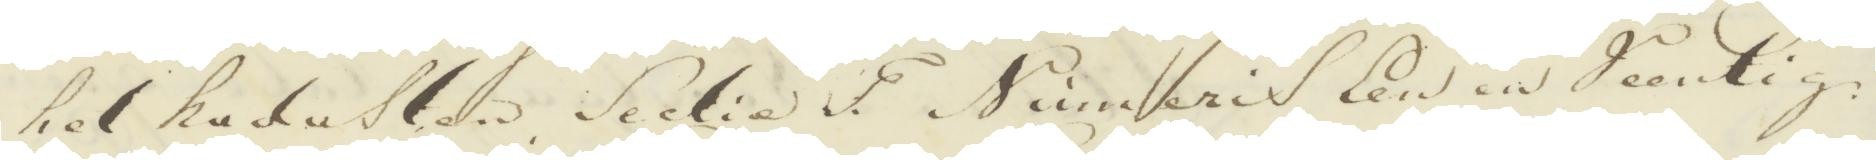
het kadaster, sectie T. Numeris Een en Veertig.
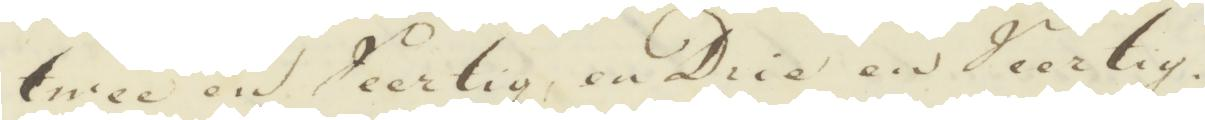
twee en Veertig, en Drie en Veertig
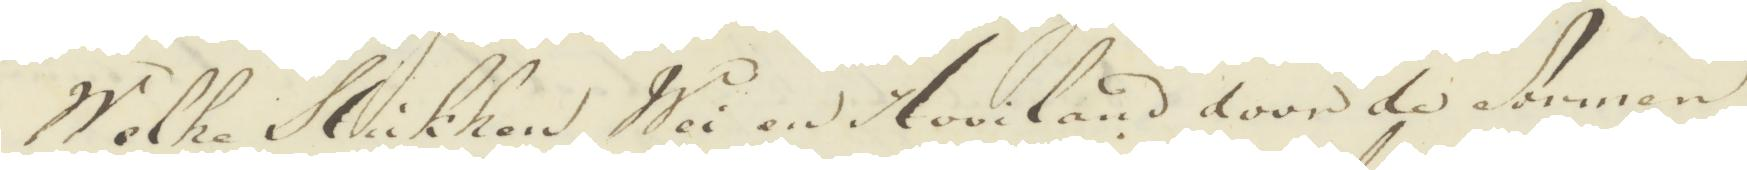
Welke stukken Wei en Hooiland door de Armen
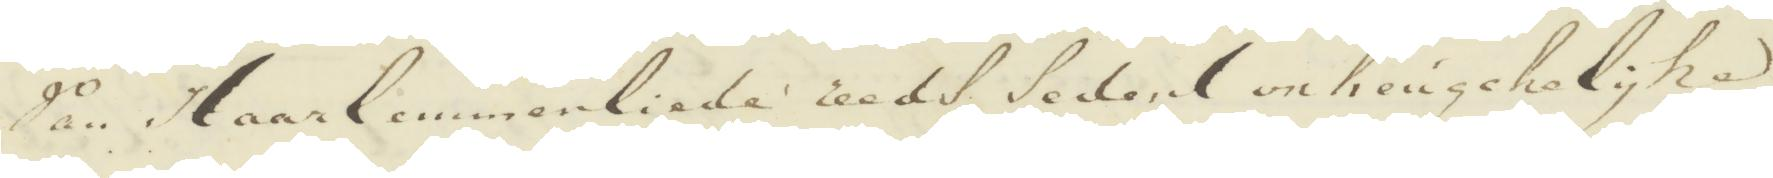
Van Haarlemmerliede reeds sedert onheugchelijke
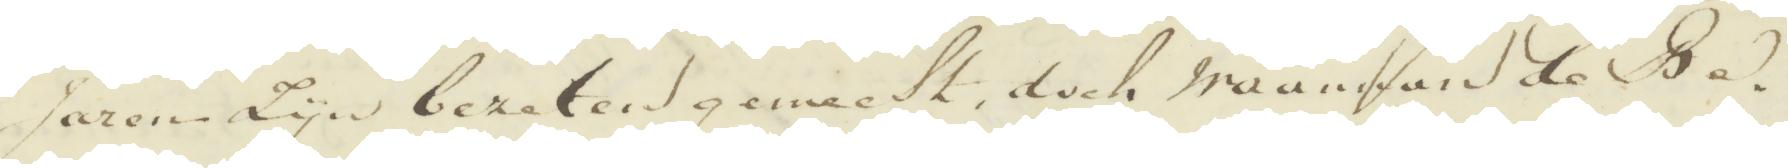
Jaren zijn bezeten geweest, doch waarvan de Be„
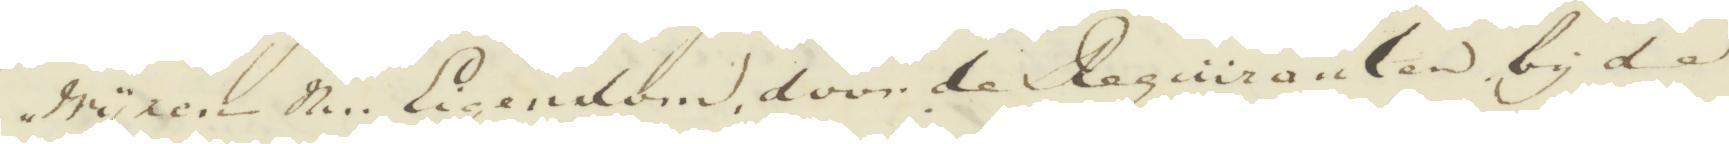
„wijzen van Eigendom, door de Requiranten, bij de
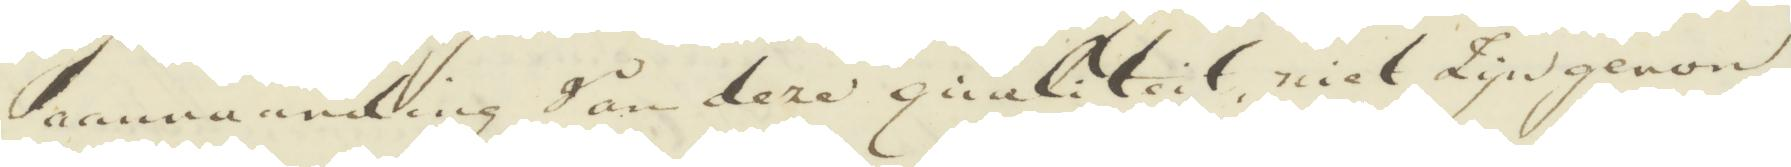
aanvaarding van deze qualiteit, niet zijn gevon
